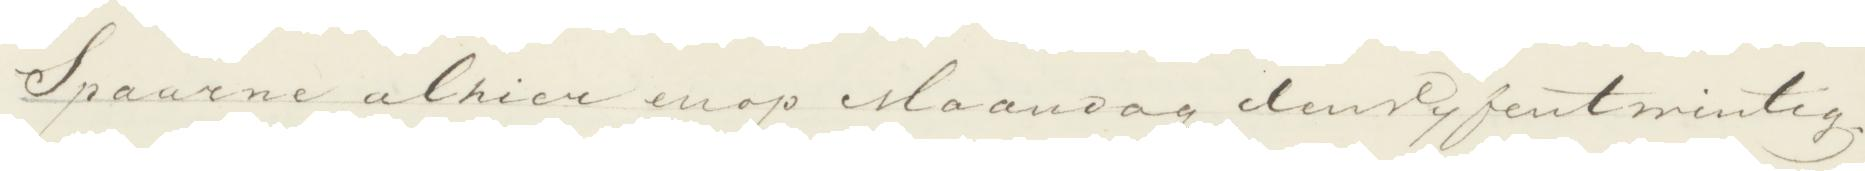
Spaarne alhier en op Maandag den vyfentwintig
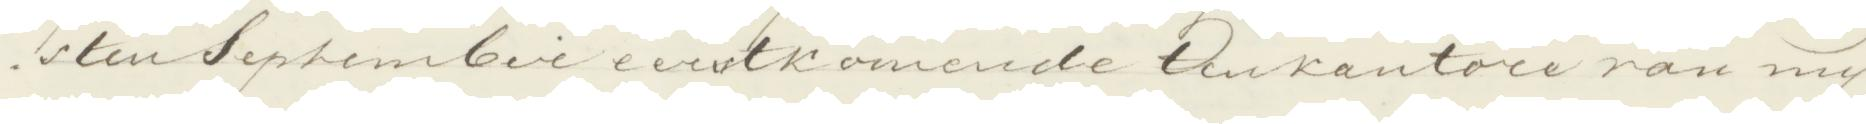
„sten September eerstkomende ten kantore van my
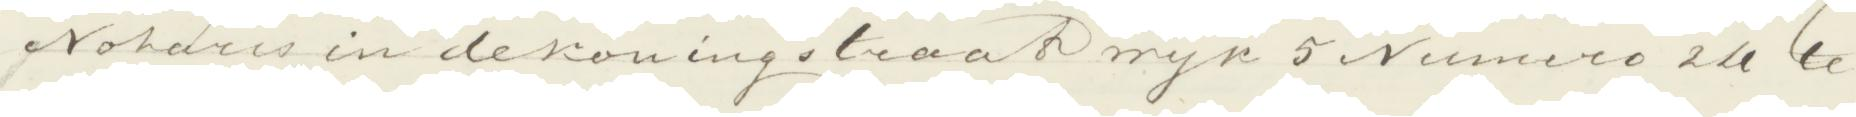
Notaris in de koningstraat wyk 5 Numero 24 te
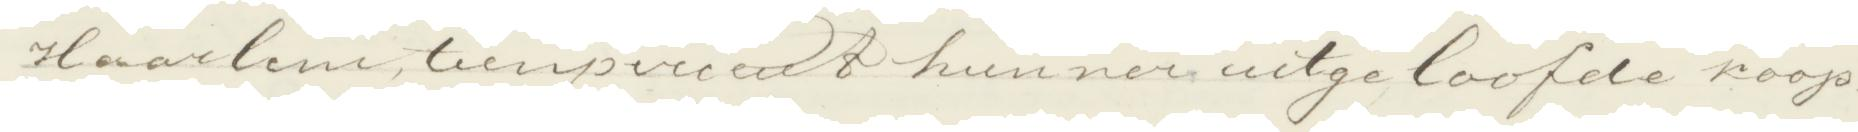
Haarlem, tien percent hunner uitgeloofde koop
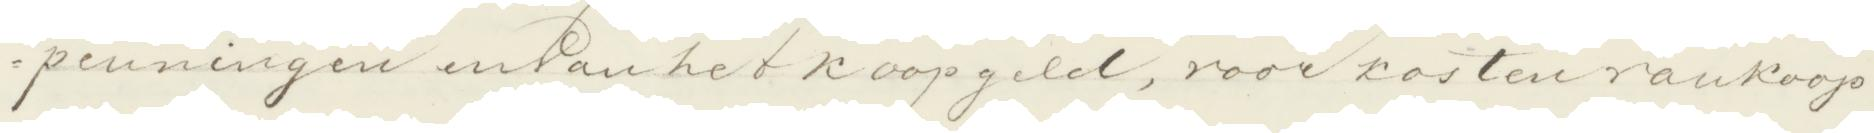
„penningen en Van het koopgeld, voor kosten van koop
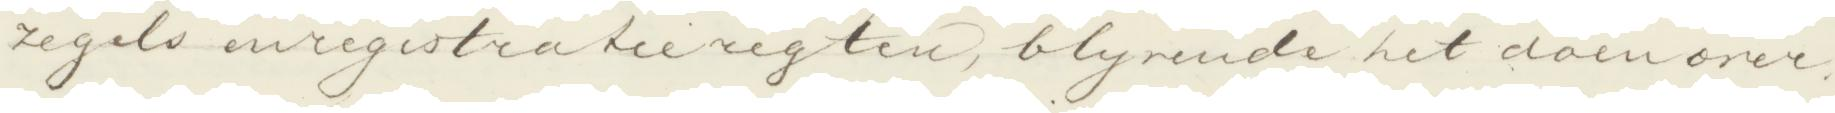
zegels en registratieregten, blyvende het doen over
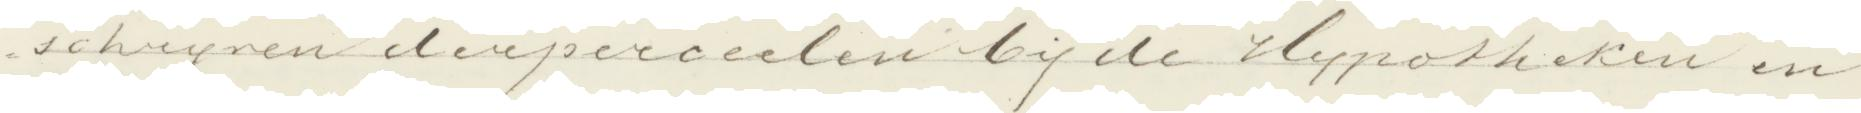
„schryven der perceelen bij de Hypotheken en
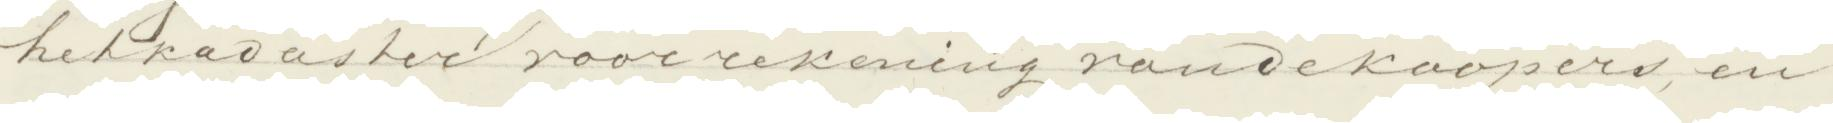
het kadaster voor rekening van de koopers, en
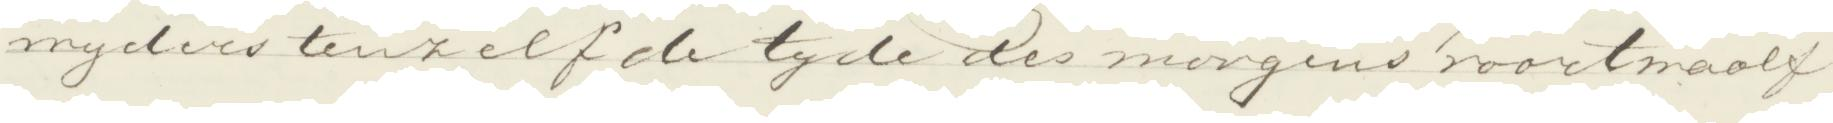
wyders tenzelfde tyde des morgens voor twaalf
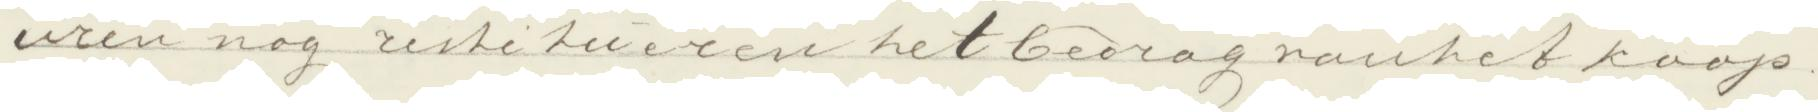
uren nog restitueren het bedrag van het koop
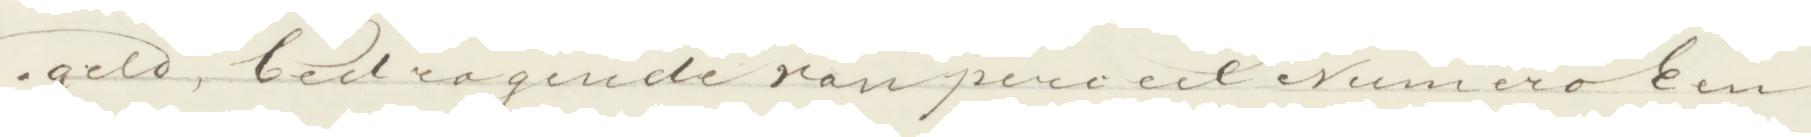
„geld, bedragende van perceel Numero Een
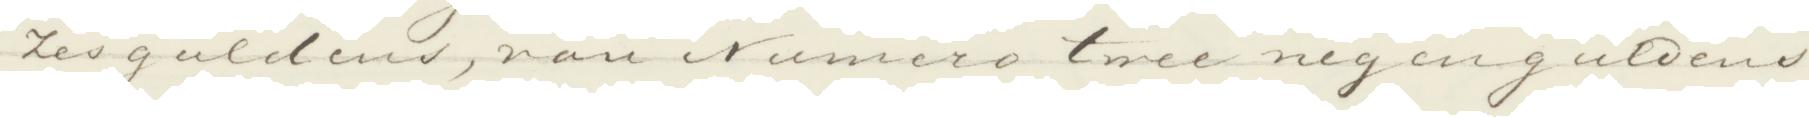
zes guldens, van Numero twee negen guldens
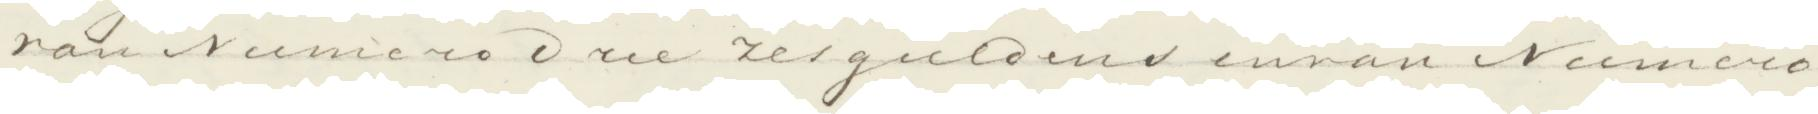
van Numero drie zes guldens in van Numero
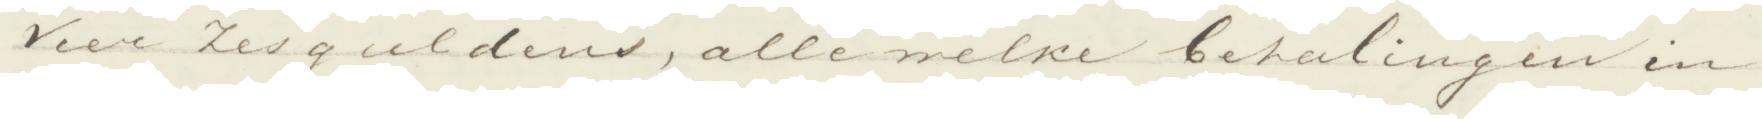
Vier zes guldens, alle welke betalingen in
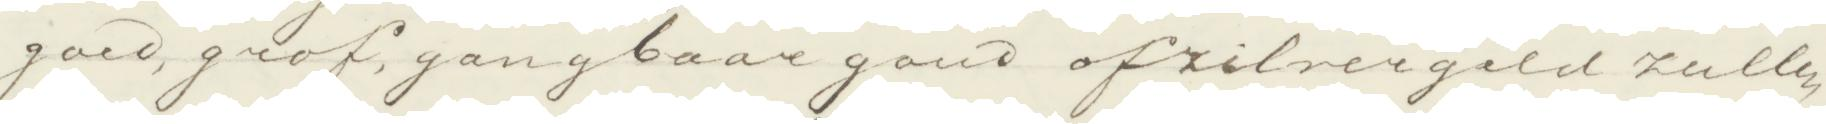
goed, grof, gangbaar goud of zilvergeld zullen
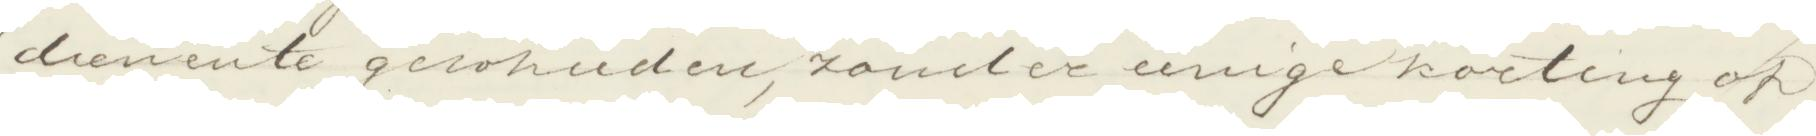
dienen te geschieden, zonder eenige korting of
